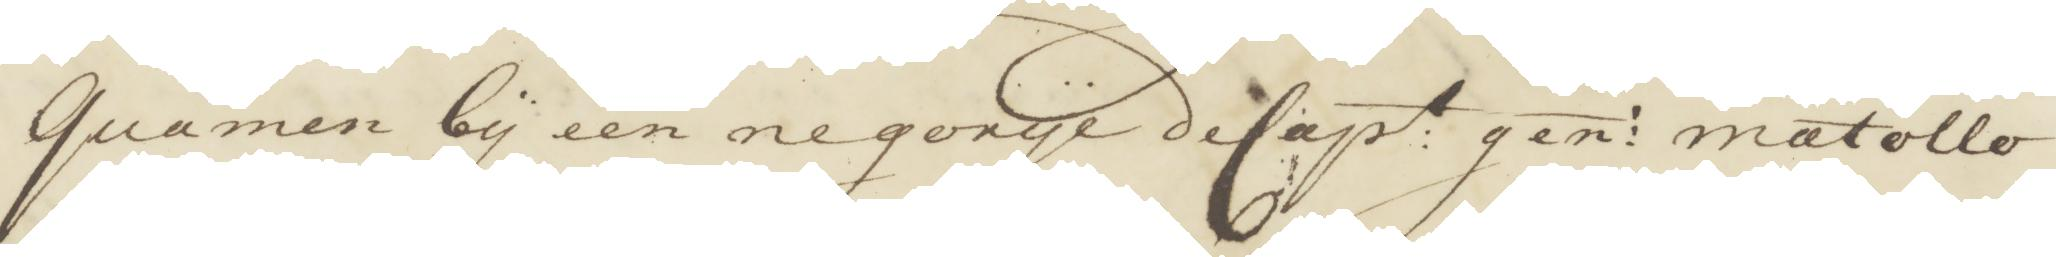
quamen bij een negorije de Cap:t gen:t matollo
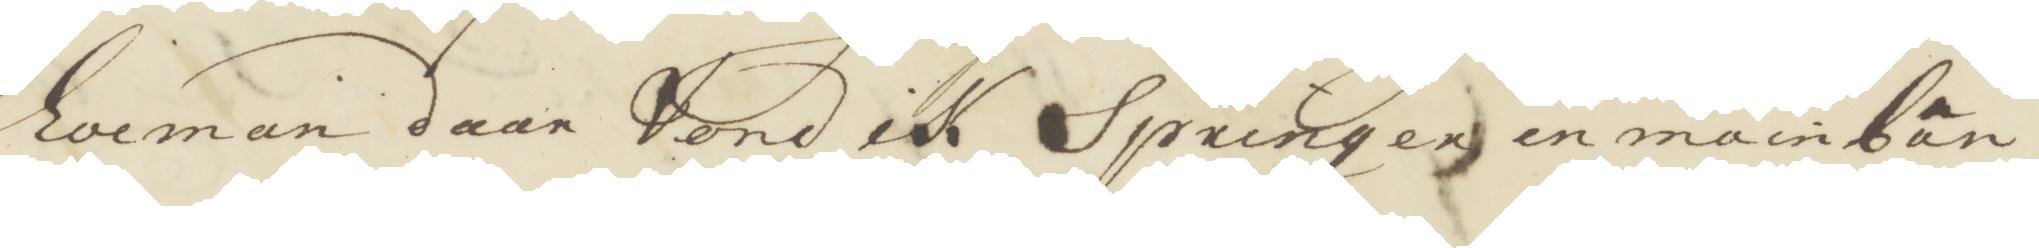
hoeman daar vond ik Springer en mainbân
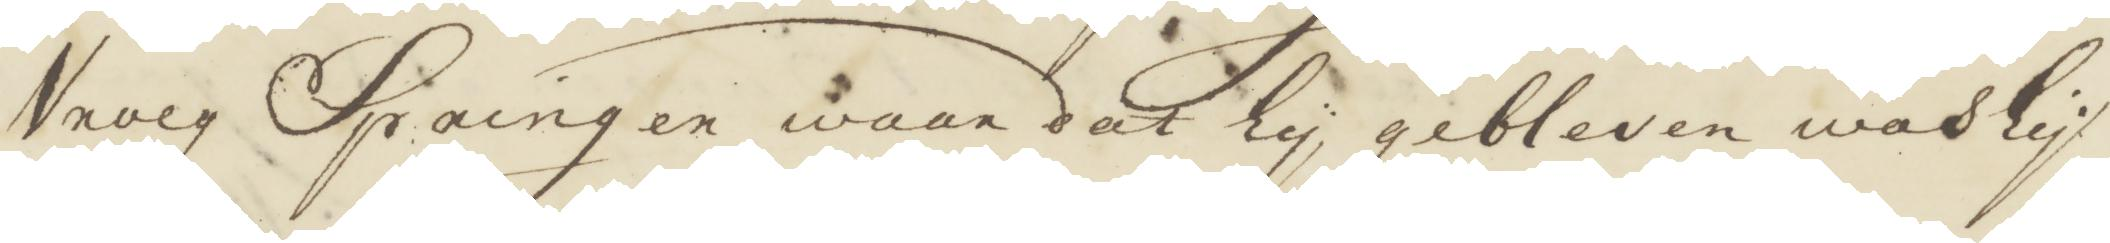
vroeg Springer waar dat hij gebleven was hij
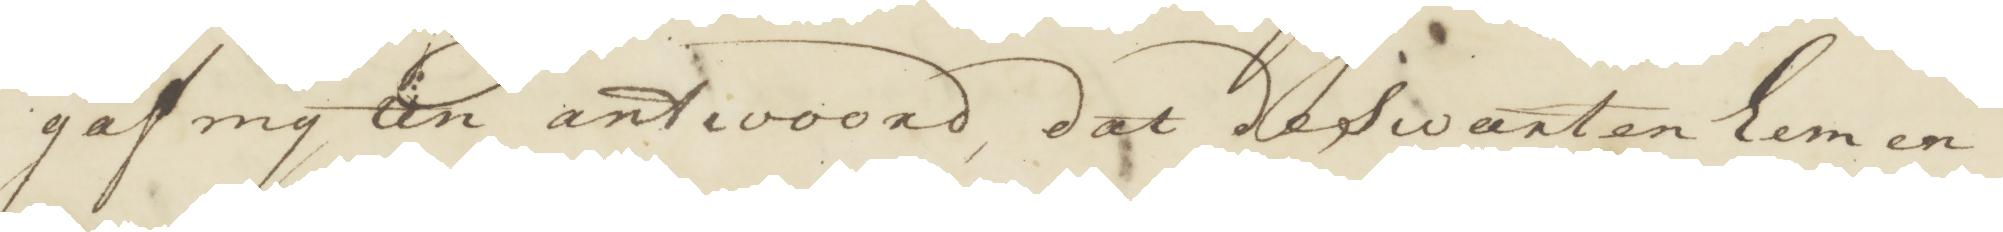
gaf mij ten antwoord, dat deswarten hem en
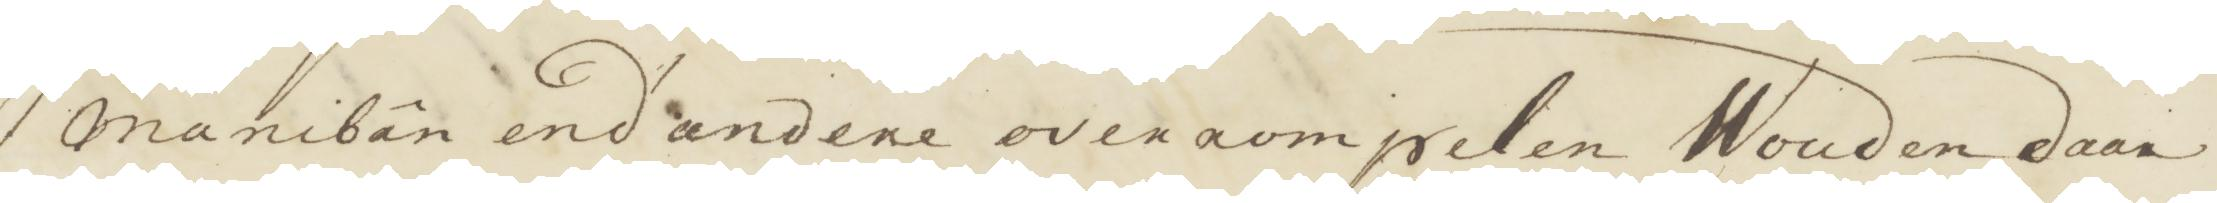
manibân end’ andere overrompelen wouden, daar
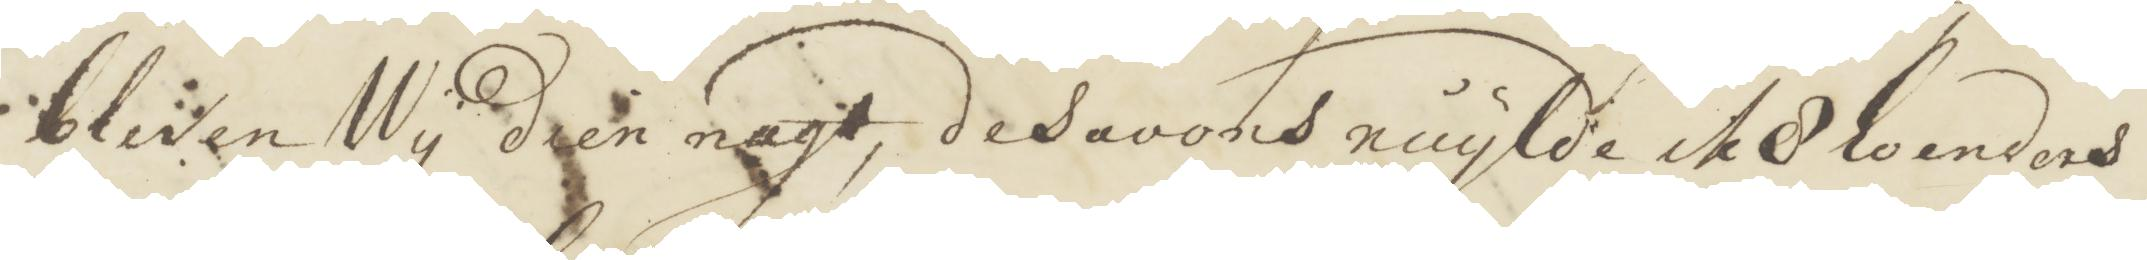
bleven wij dien nagt, des avons ruijlde ik 8 hoenders
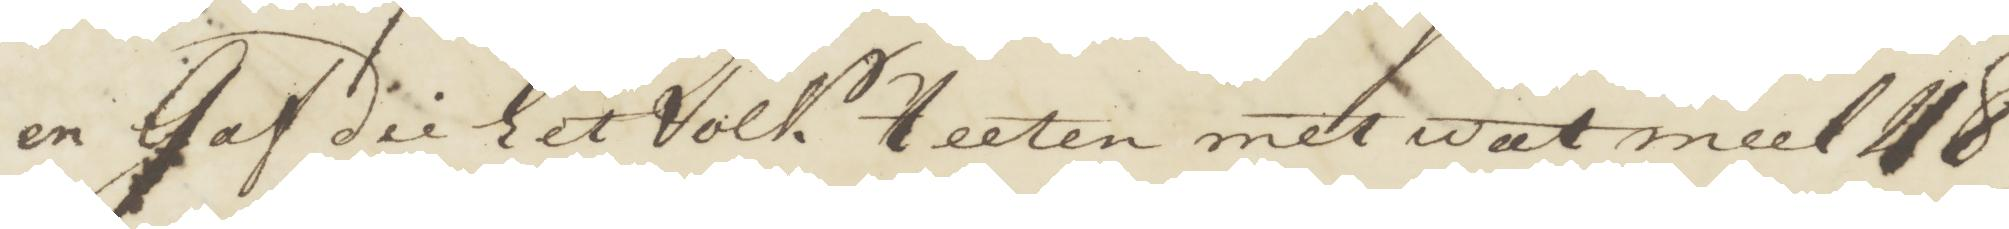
en gaf die het volk 't eeten met wat meel 48
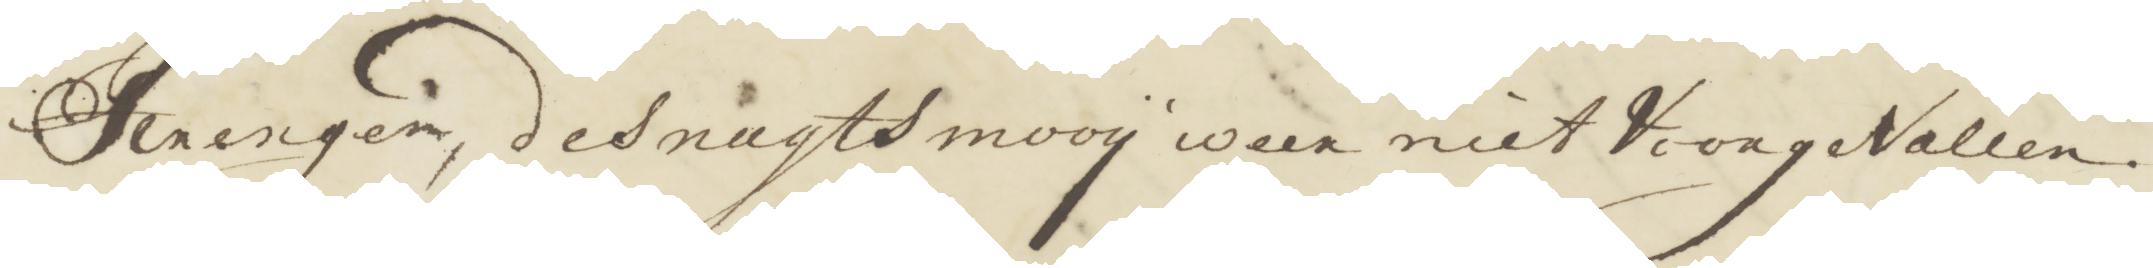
Serengen, des nagts mooij weer niet voorgevallen.
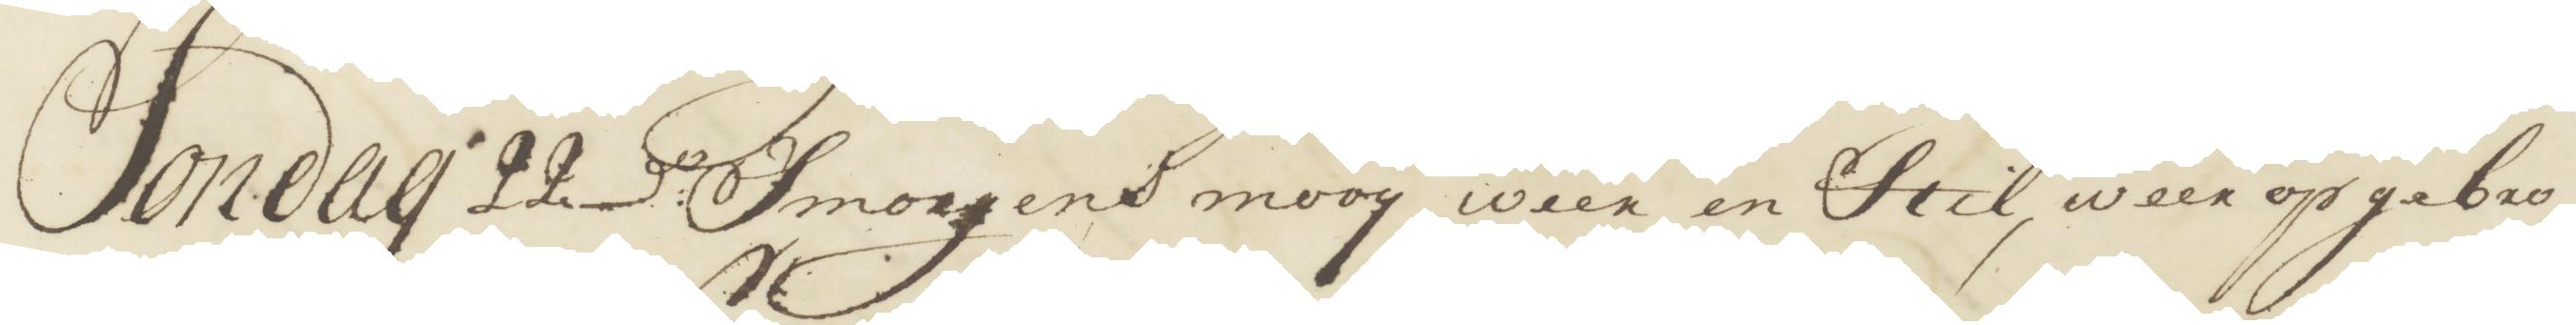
Sondag 22. _:o Smorgens mooij weer en stil, weer op gebro
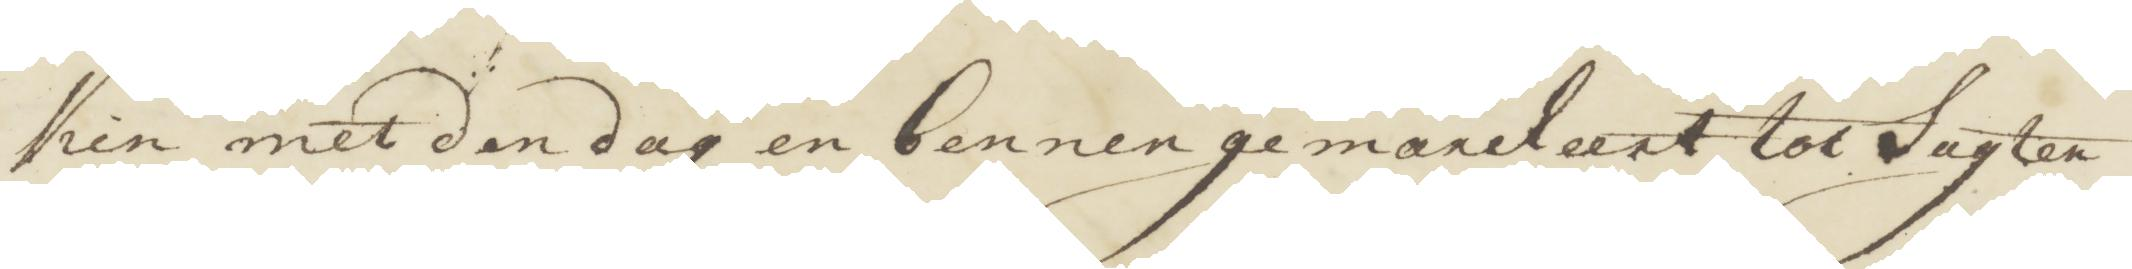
ken met den dag en bennen gemarcheert tot sagter
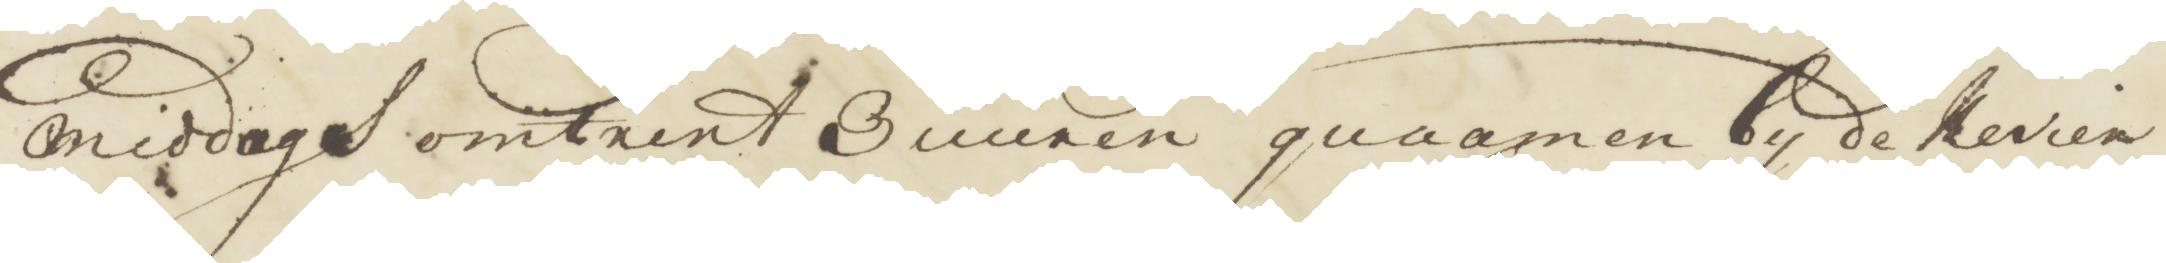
middags omtrent 3 uuren quaamen by de kevier
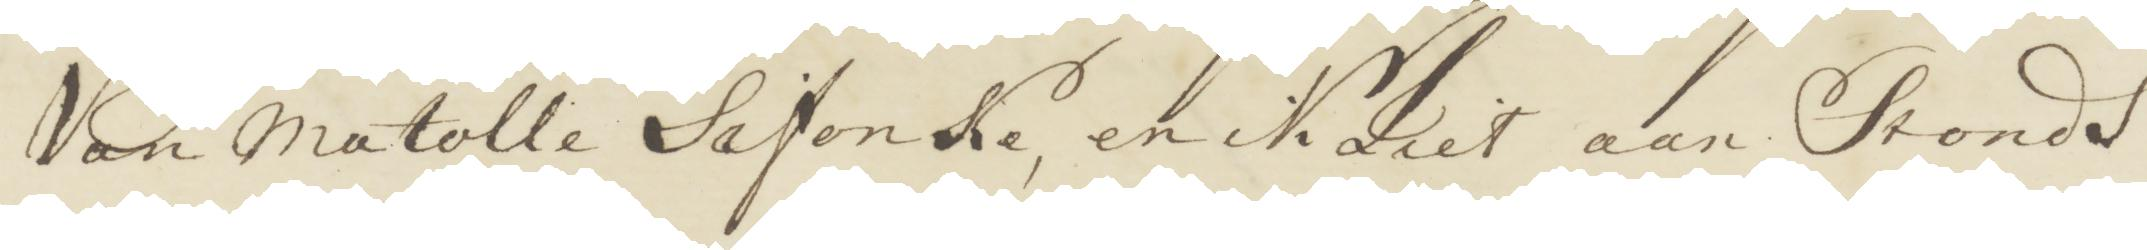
van matolle Safonke, en ik Liet aan Stonds
